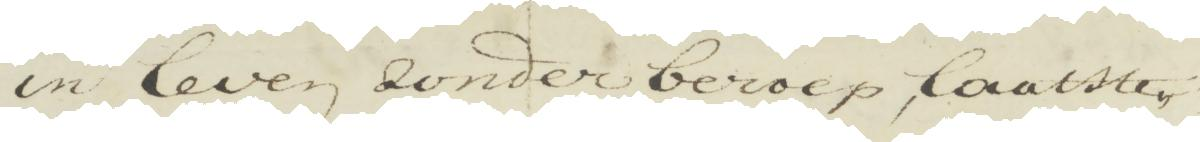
in leven zonder beroep, laatste„
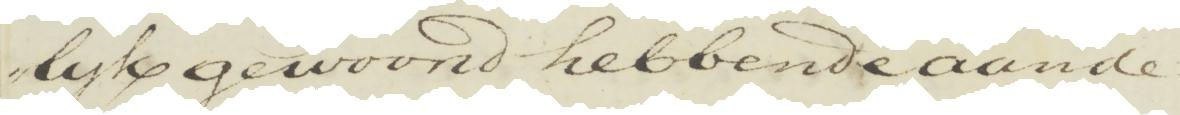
„lyk gewoond hebbende aan de
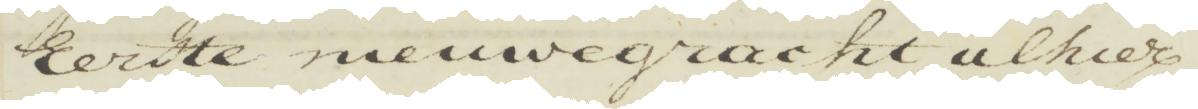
Eerste nieuwegracht alhier
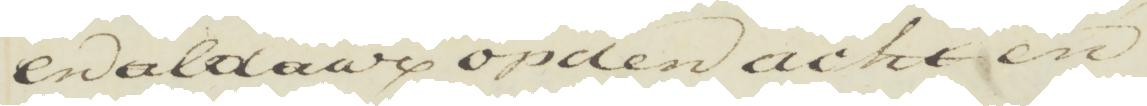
en aldaar opden acht en
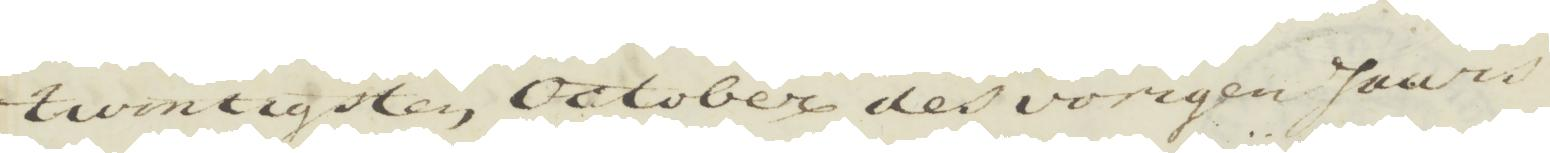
twintigsten October des vorigen Jaars
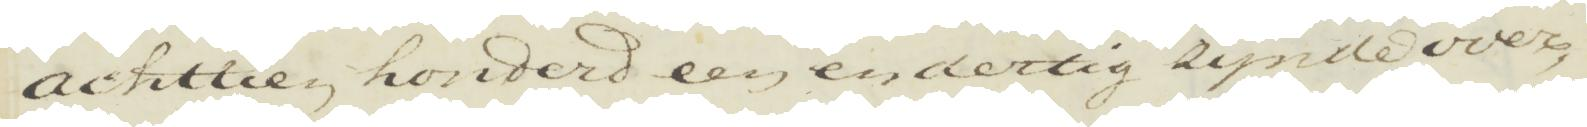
achttien honderd een en dertig zijnde over„
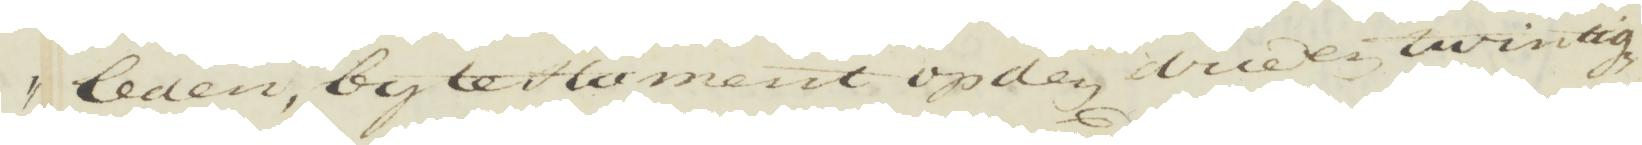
„leden, bij testament op den drie en twintig
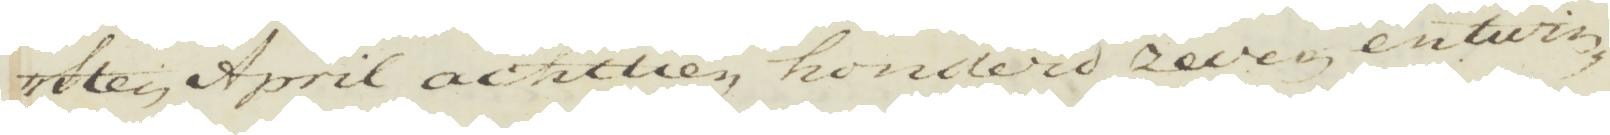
weten April achttien honderd zeven en twin„
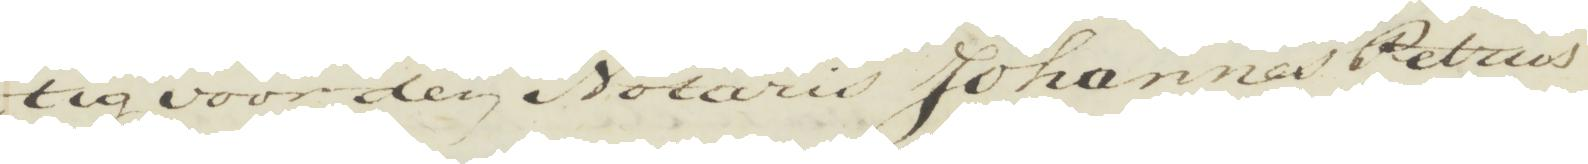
„tig voor den Notaris Johannes Petrus
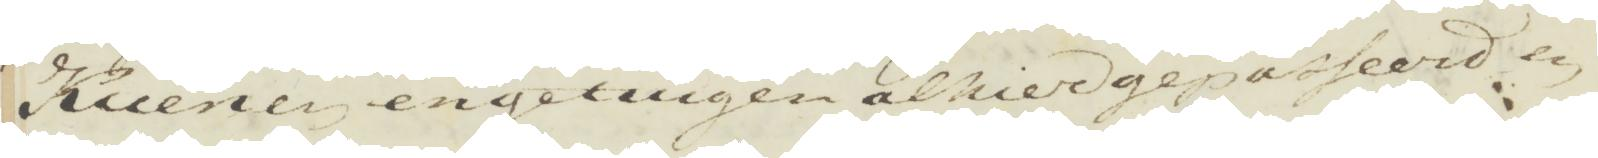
Kuenen en getuigen alhier gepasseerd en
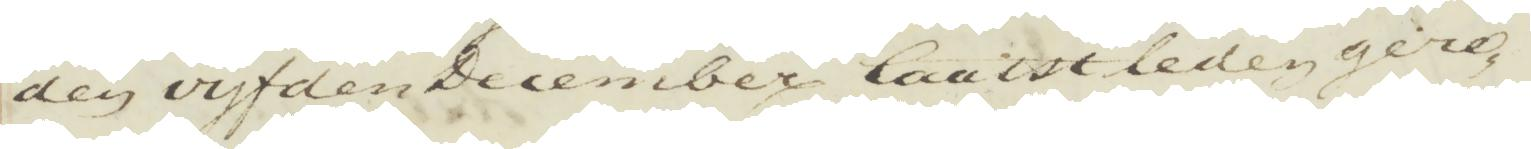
den vyfden December laatst leden gere„
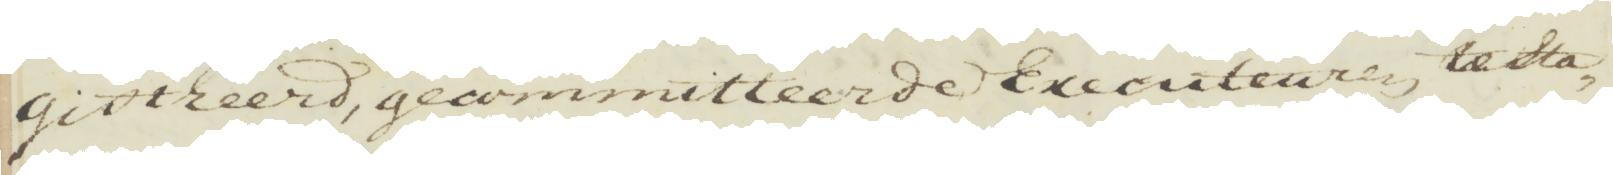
gistreerd, gecommitteerde Executeuren, testa„
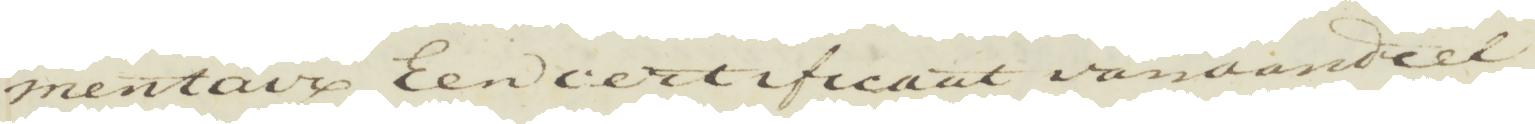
mentair Een certificaat van aandeel
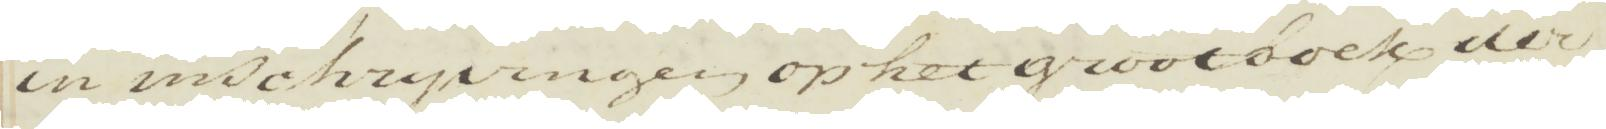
in inschryvingen op het grootboek der
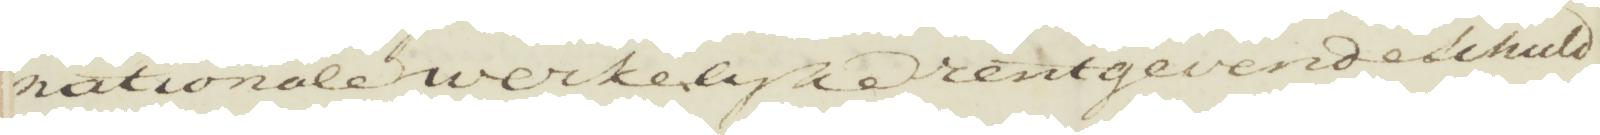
nationale werkelyke rentgevende schuld
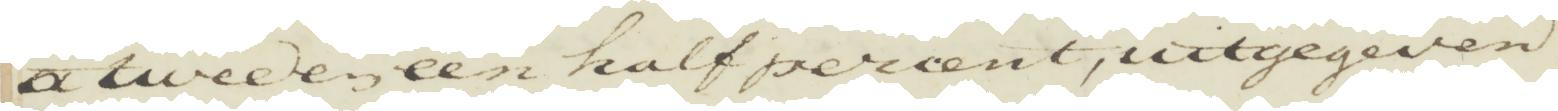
à twee en een half percent, uitgegeven
